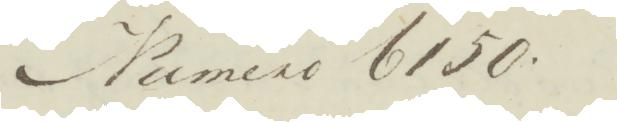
Numero 6150.
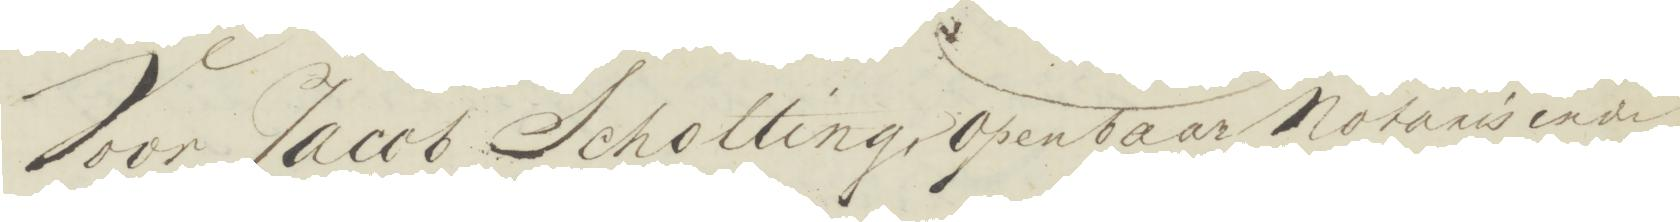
Voor Jacob Scholting, openbaar Notaris in de
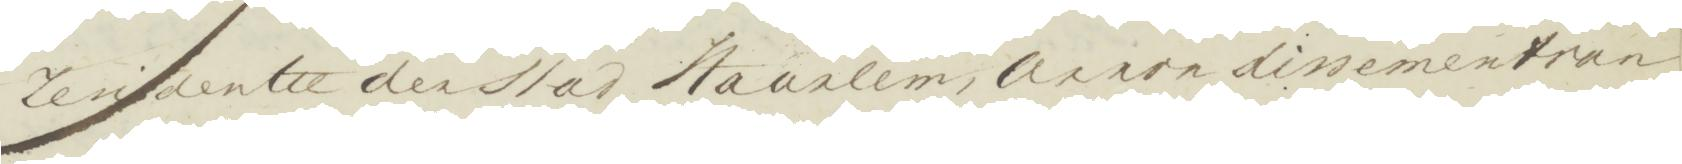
residentie der stad Haarlem, Arrondissement van
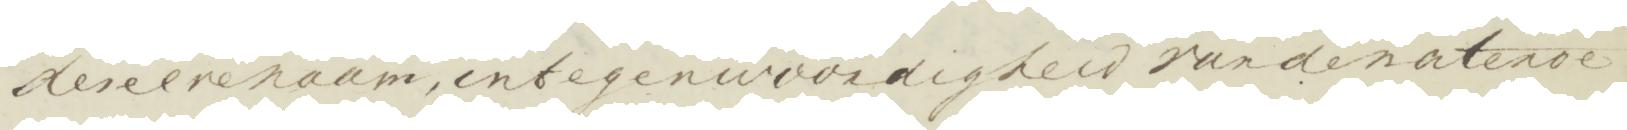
deselve naam, in tegenwoordigheid van de natenoe
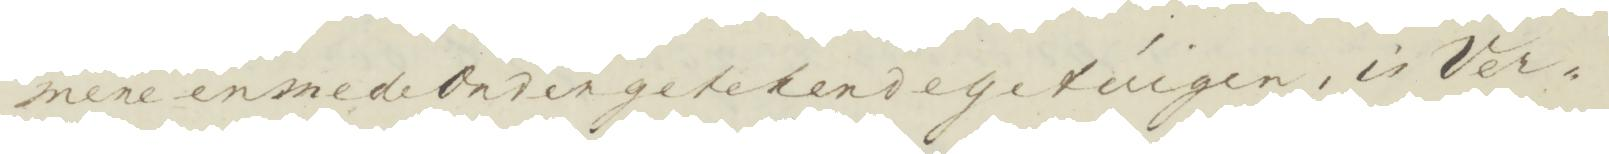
mene en mede ondergetekende getuigen, is Ver„
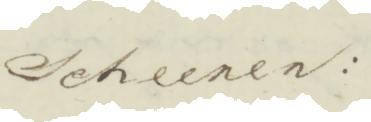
scheenen:
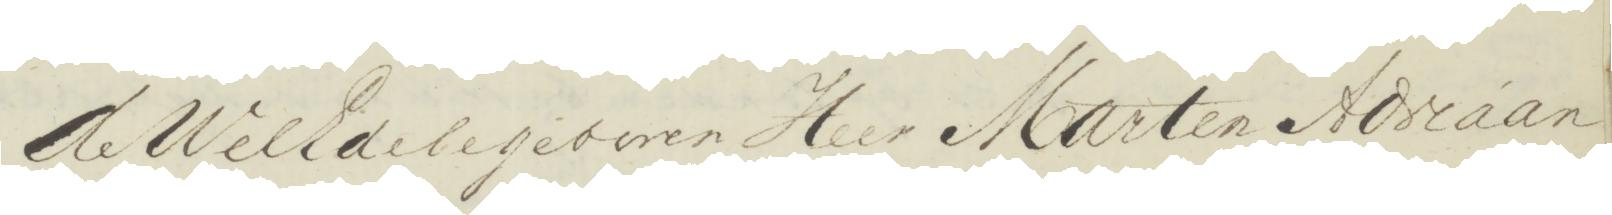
de WelEdelegeboren Heer Marten Adriaan
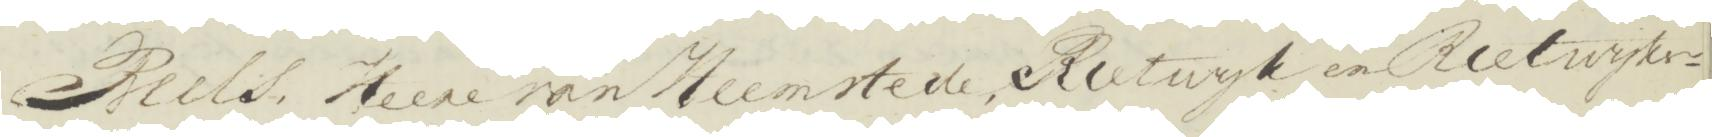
Peels, Heere van Heemstede, Rietwyk en Rietwijks„
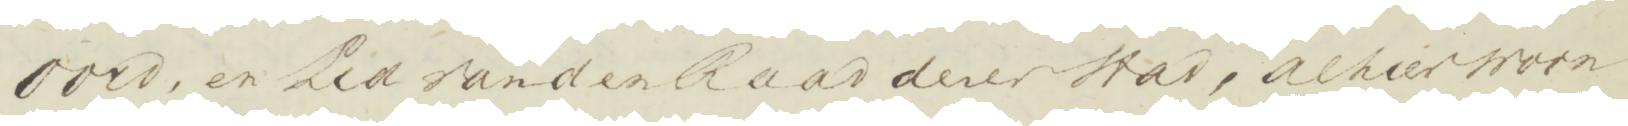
oord, en Lid van den Raad deser stad, alhier woon
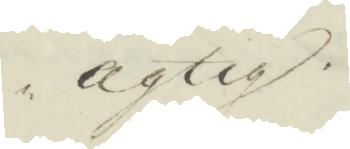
„agtig.
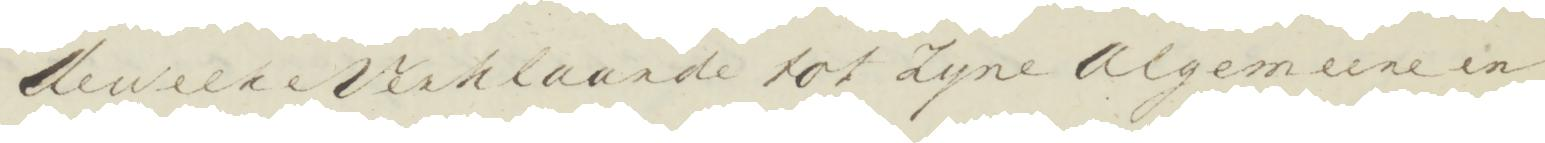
dewelke verklaarde tot zyne algemeene in
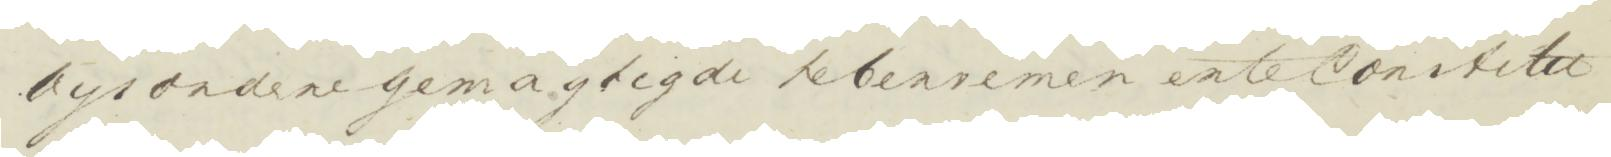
bysondere gemagtigde te benoemen en te constitu
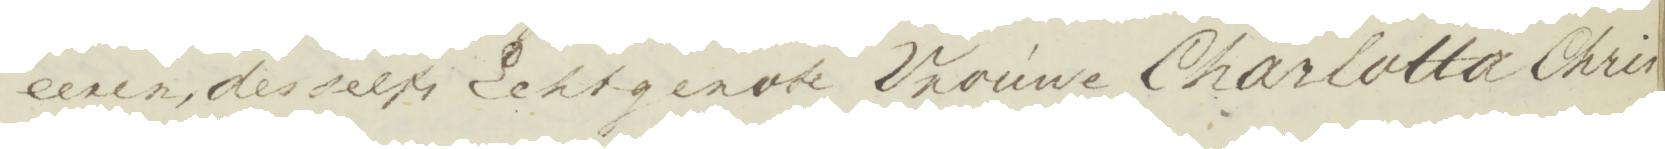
eeren, desselfs Echtgenote Vrouwe Charlotta Chris
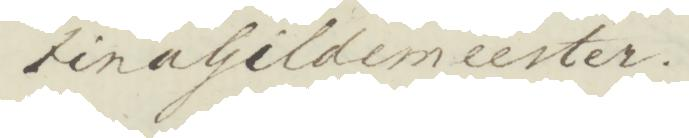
tina Gildemeester.
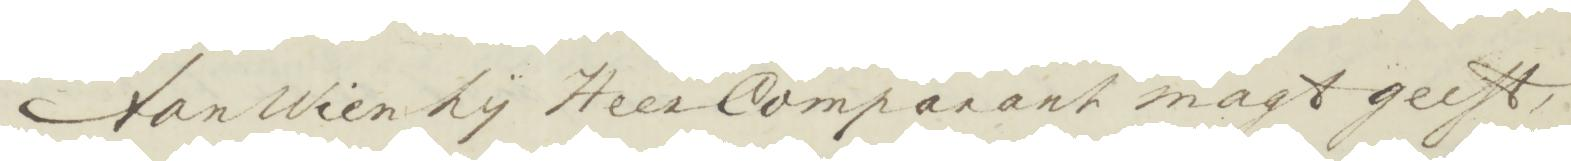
Aan Wien hij Heer Comparant magt geeft,
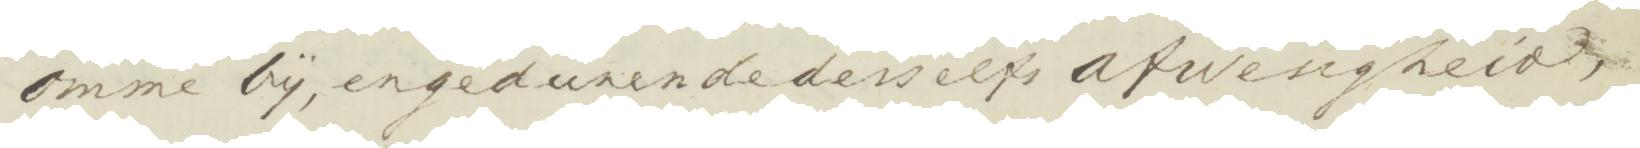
omme bij, en gedurende desselfs afwesigheid,
